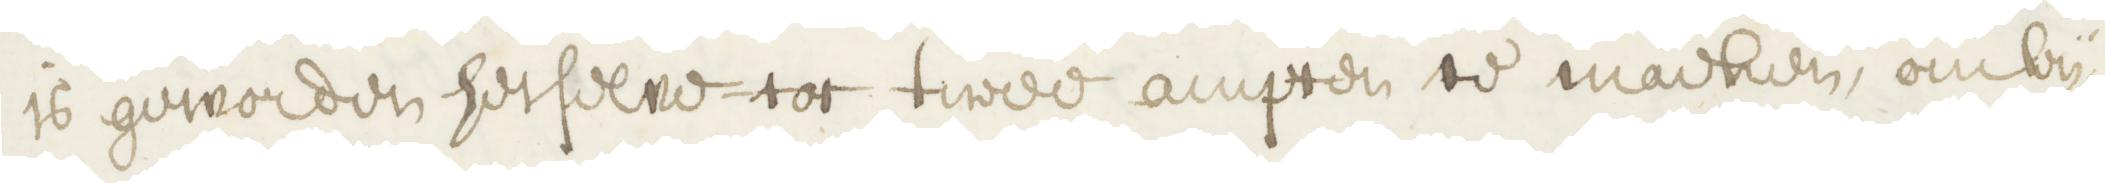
is geworden het selve tot twee ampten te maeken, om bij
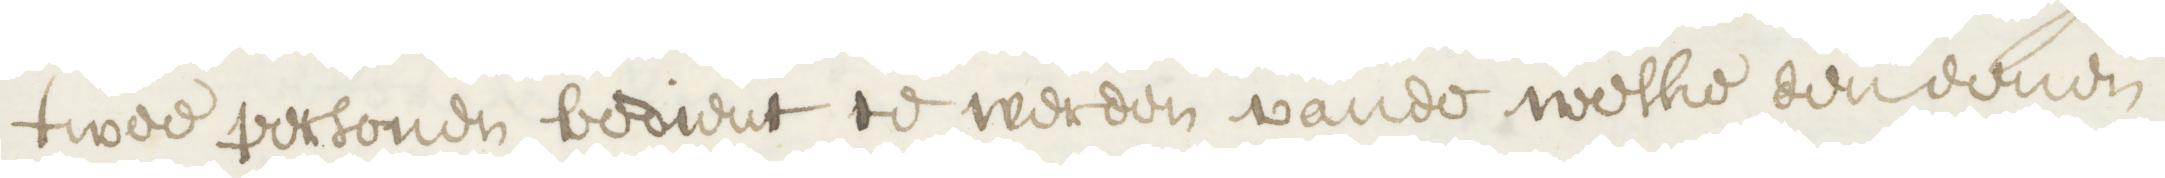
twee personen bedient te werden van de welke den eenen
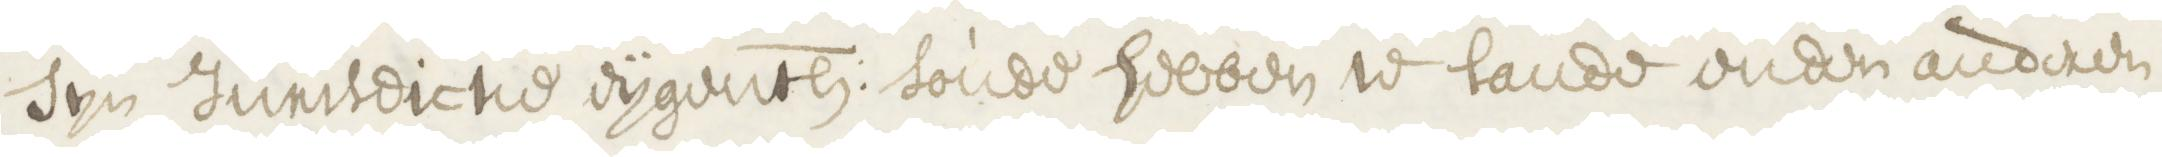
sijn Jurisdictie eijgentlijk soude hebben te lande en den anderen
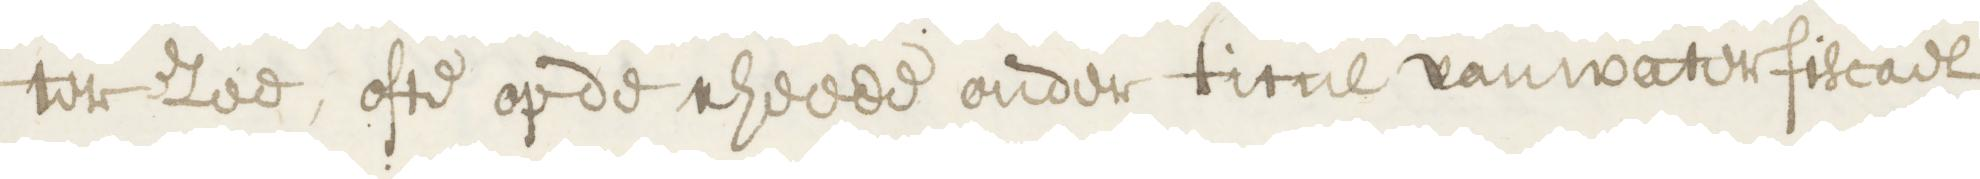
ter Zee, ofte op de rheede onder titul van waterfiscael
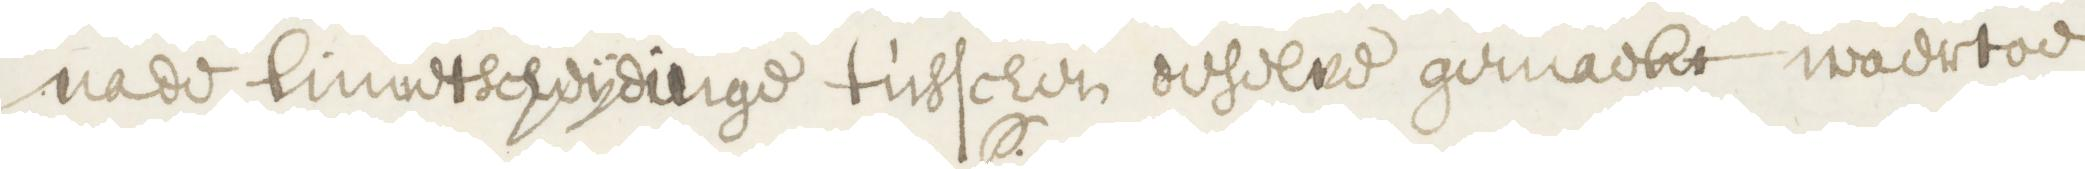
na de limietscheijdinge tusschen deselve gemaekt waer toe
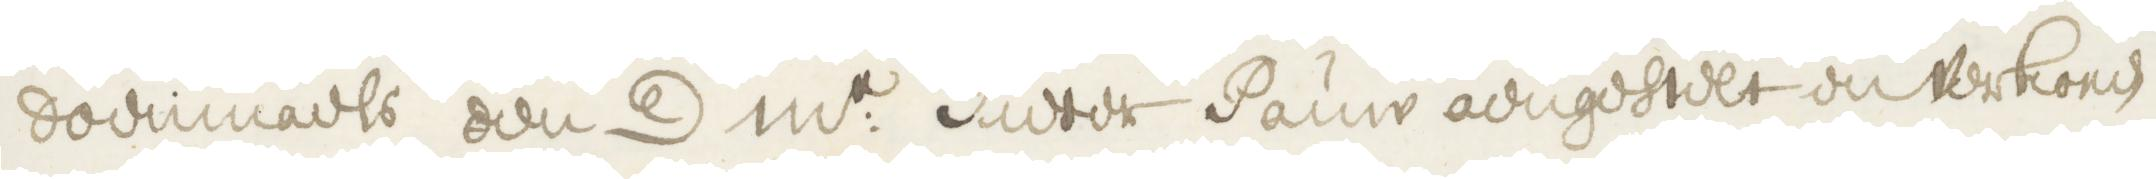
doenmaels den E M:r Pieter Pauw aengestelt en verkoren
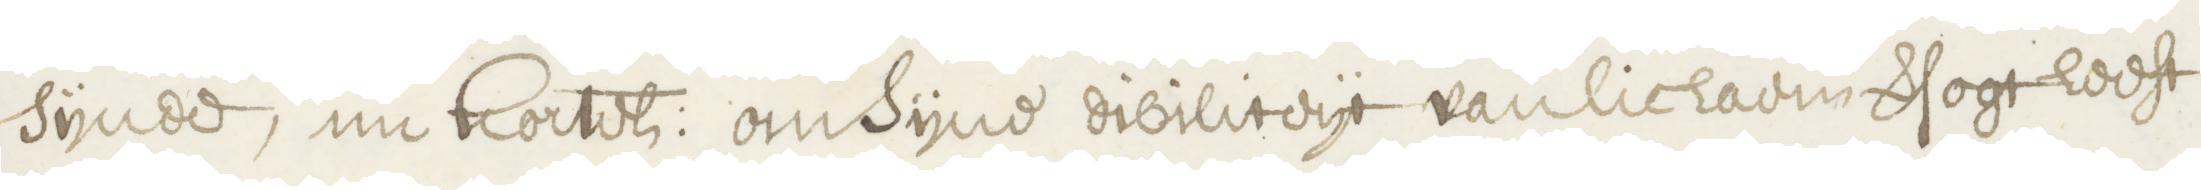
sijnde, nu kortel: om sijne dibiliteijt van lichaem versogt heeft
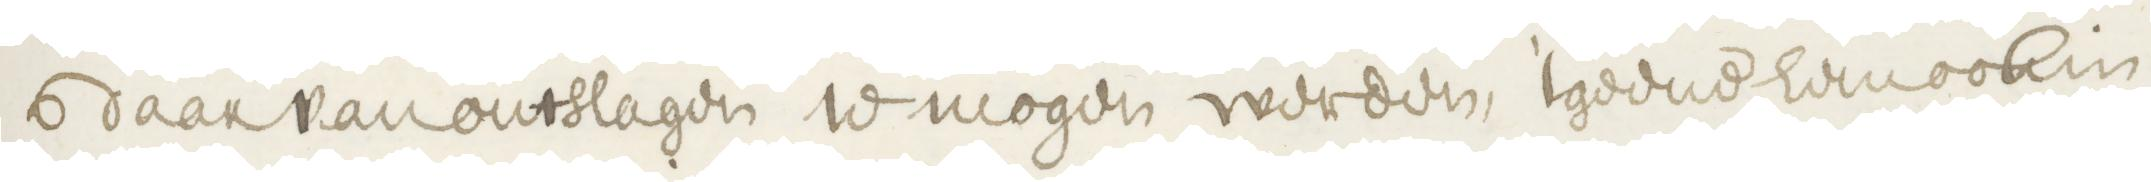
daar van ontslagen te mogen werden, ’t geene hem ook in
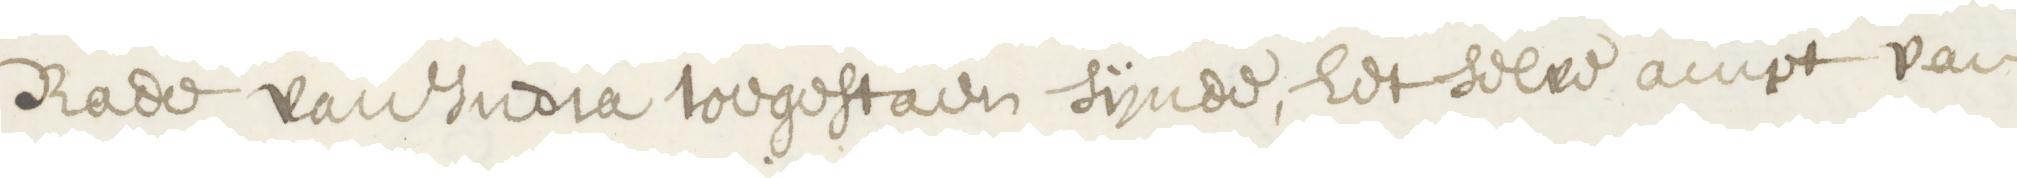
Rade van India toegestaen sijnde, het selve ampt van
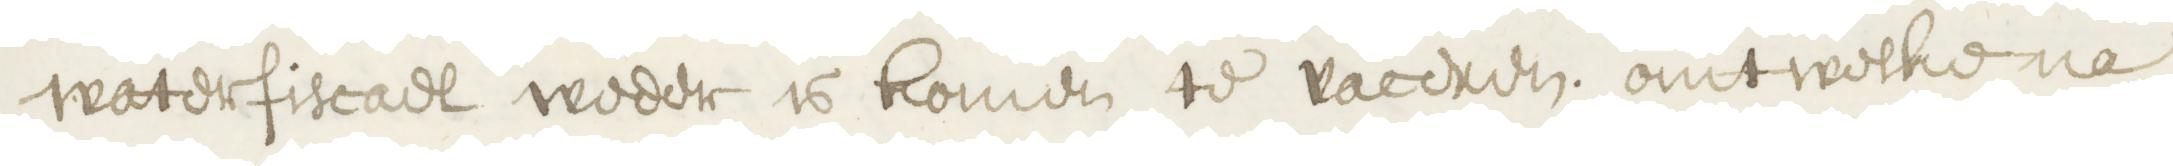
waterfiscael weder is komen te vaceren. om 't welke na
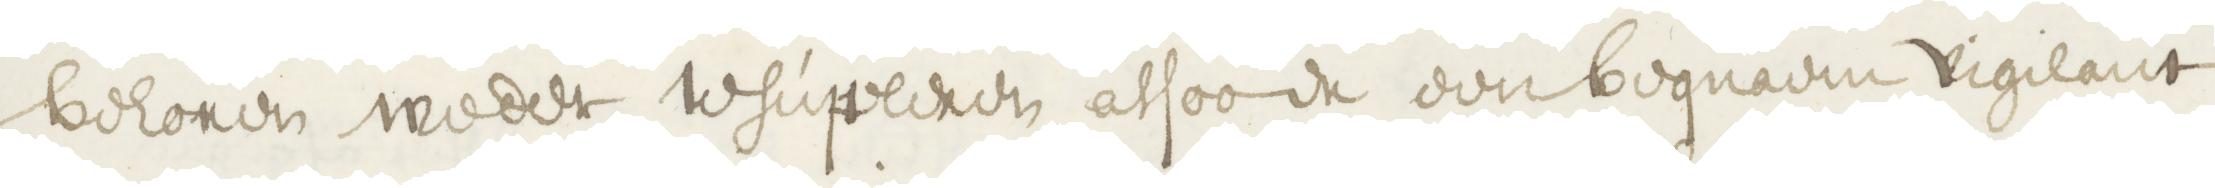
behoren weder te suppleren alsoo er een bequaem vigilant
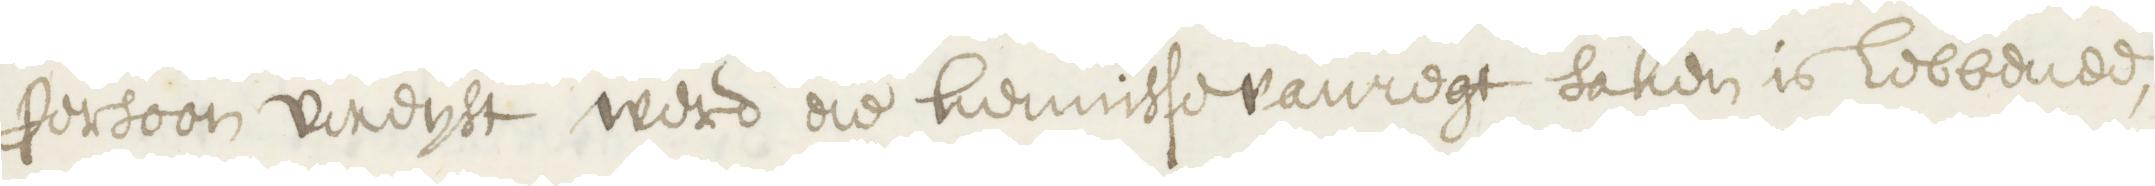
persoon vereijst werd die kennisse van regt saken is hebbende,
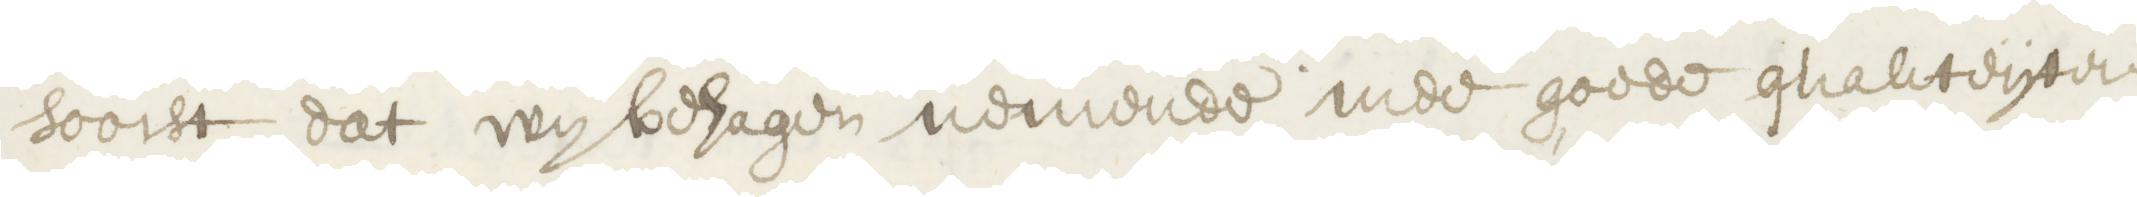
soo is 't dat wij behagen nemende inde goede qualiteijten
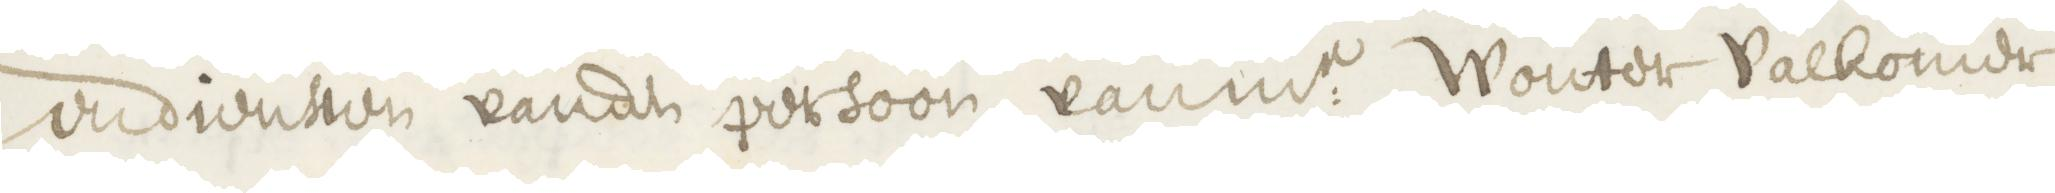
en diensten vanden persoon van m:r Wouter Valkonier
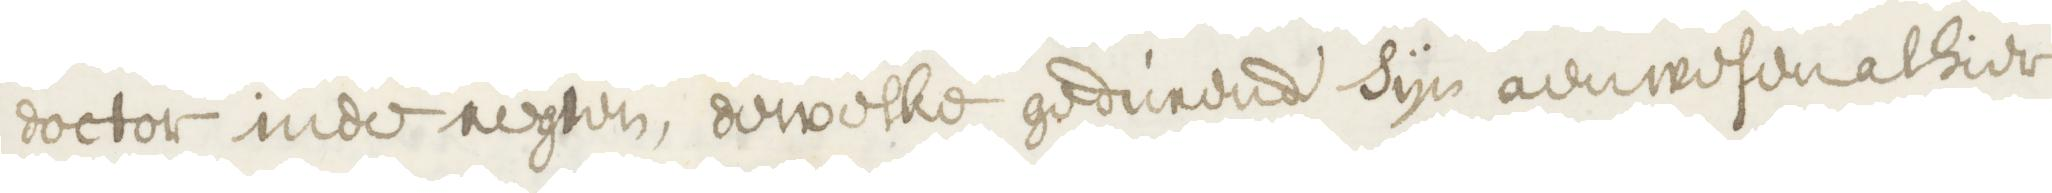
doctor inde regten, dewelke gedurende sijn aenwesen alhier
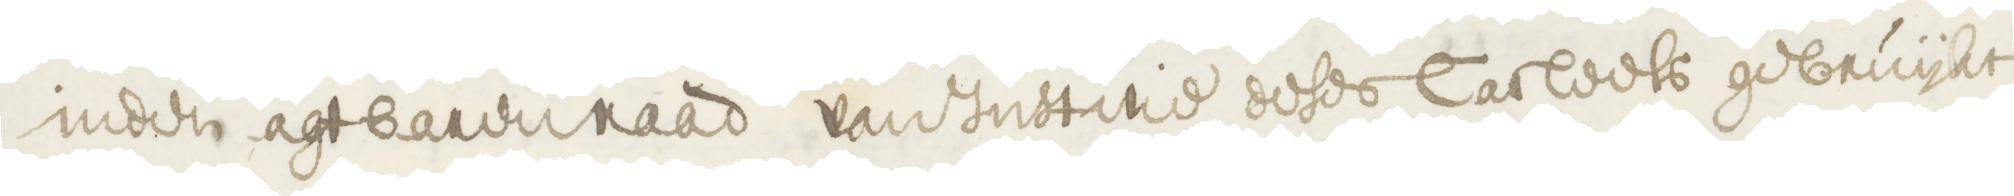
in den agtbaren raad van Iustitie deses Casteels gebruijkt
